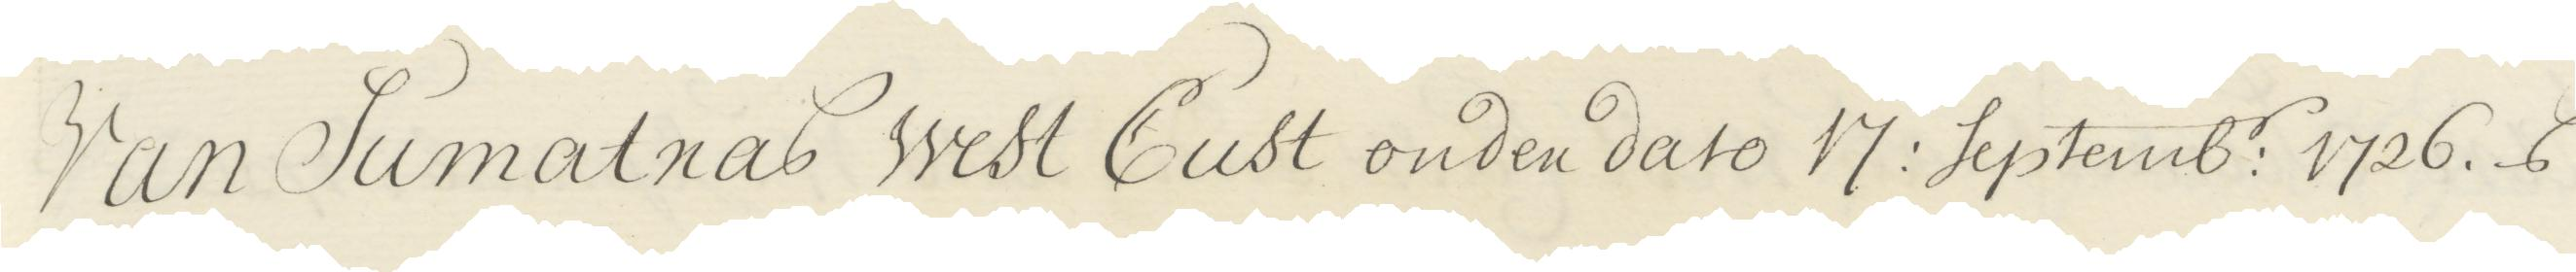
Van Sumatras West Cust onder dato 17:' Septemb:r 1726.
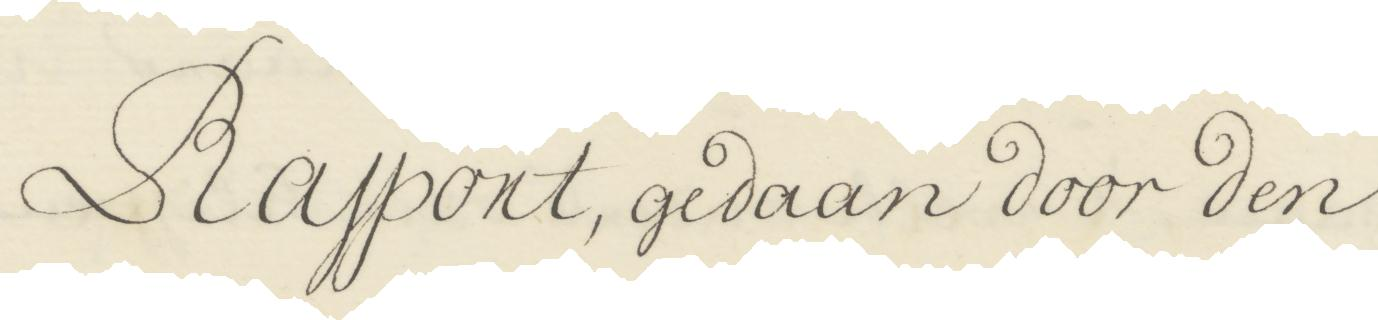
Rapport, gedaan door den
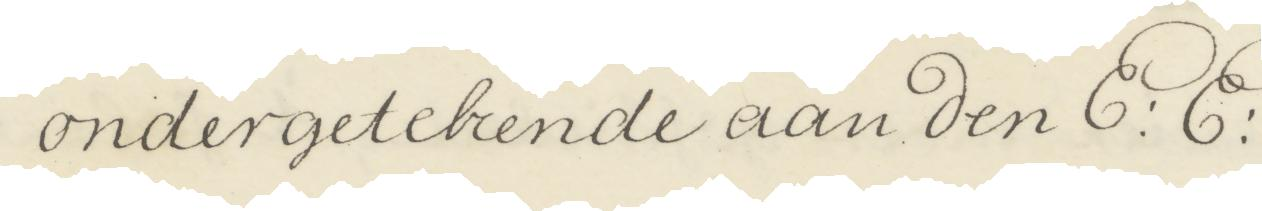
ondergetekende aan den E: E:
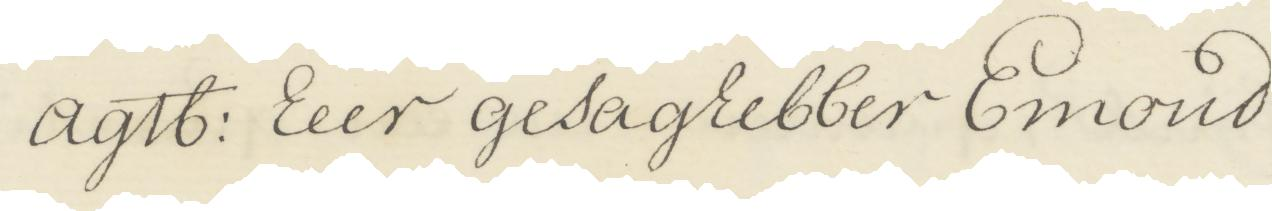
Agtb: heer gesaghebber Emond
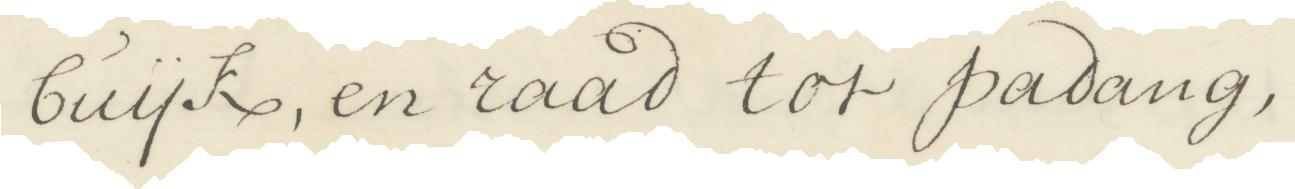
buijk en raad tot padang.
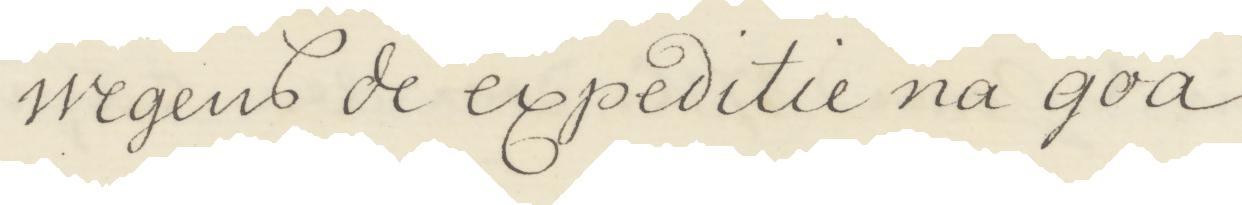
wegens de expeditie na goa
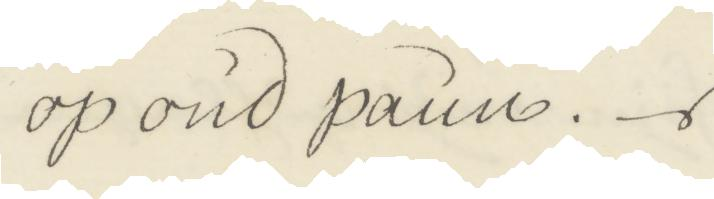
op oud pauw.
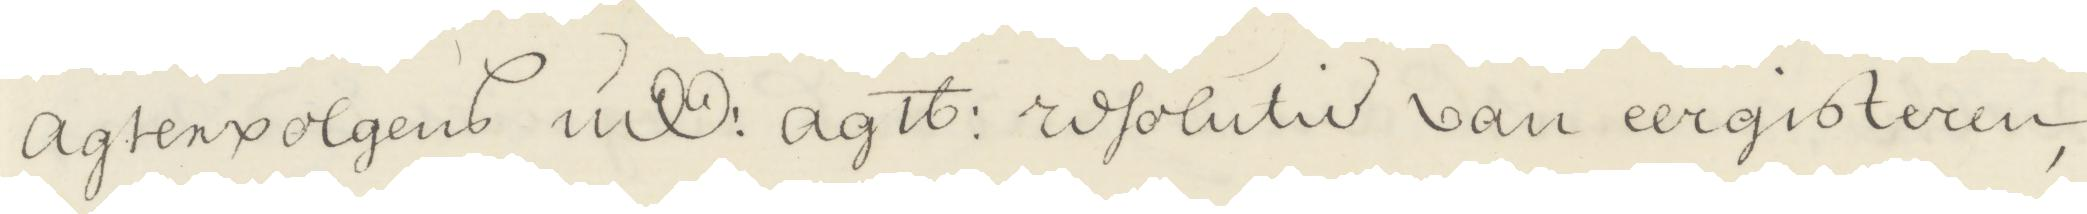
agtervolgens uEE: Agtb: resolutie van eergisteren
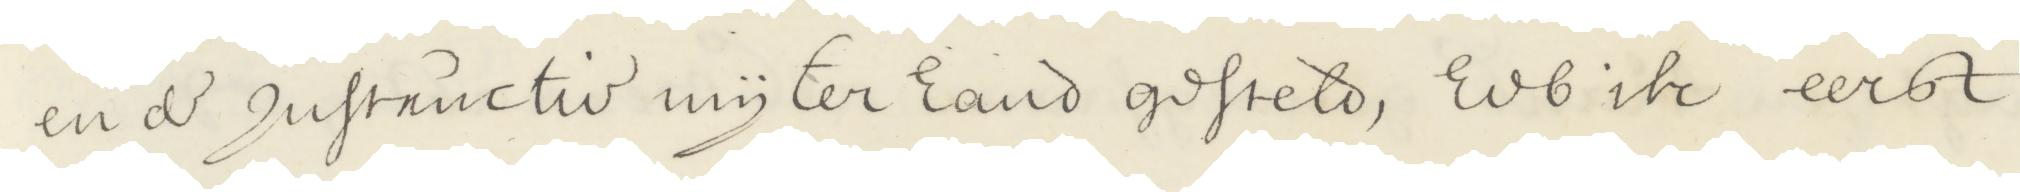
en de Jnstructie mij ter hand gesteld, heb ik eerst
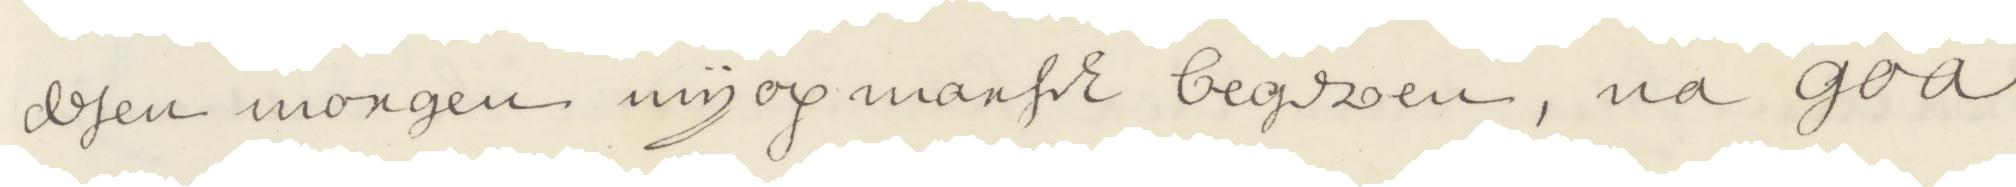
desen morgen mij op marsch begeven, na goa
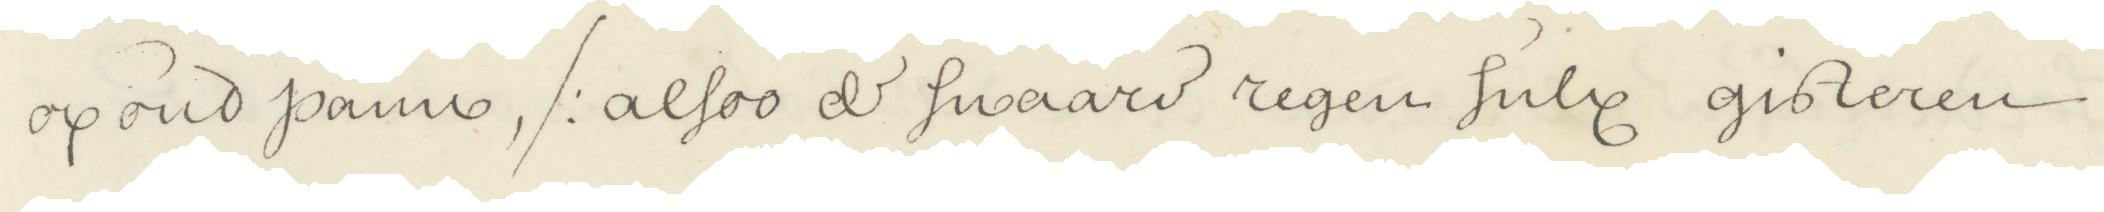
op oud pauw, /: alsoo de swaare regen sulx gisteren
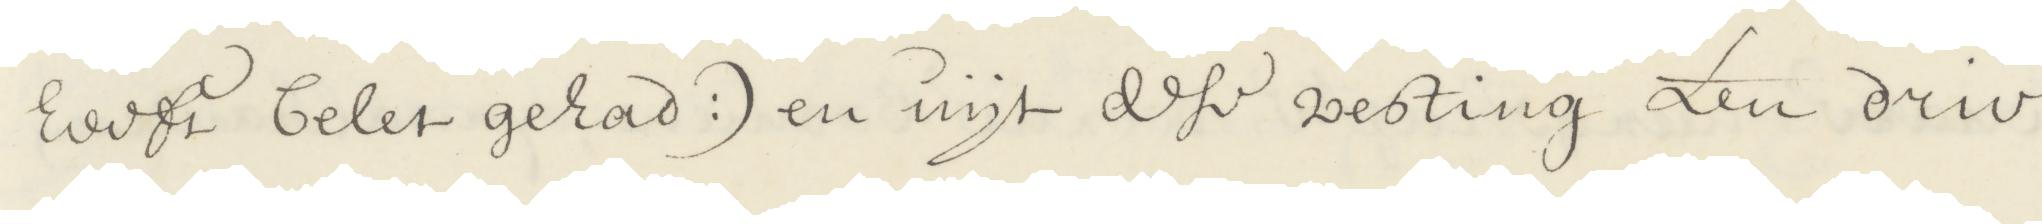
heeft belet gehad :) en uijt dese vesting ten drie
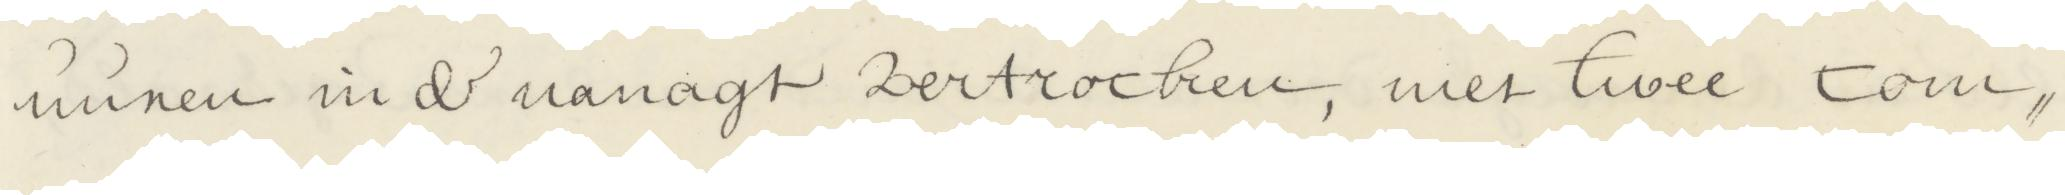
uuren in de nanagt vertrocken, met twee com„
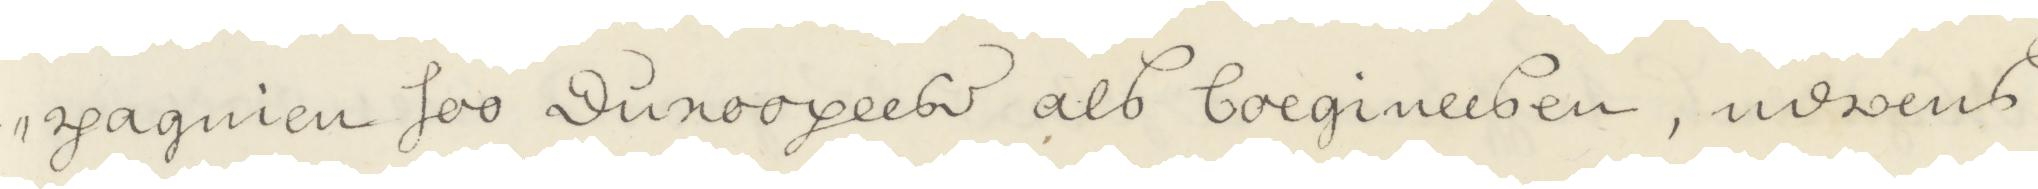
„pagnien Soo Euroopeese als boegineesen, nevens
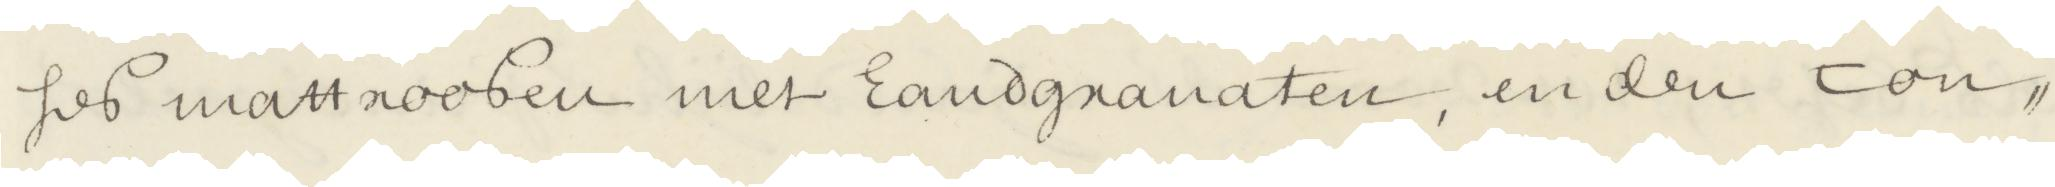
ses mattroosen met handgranaten, en den con„
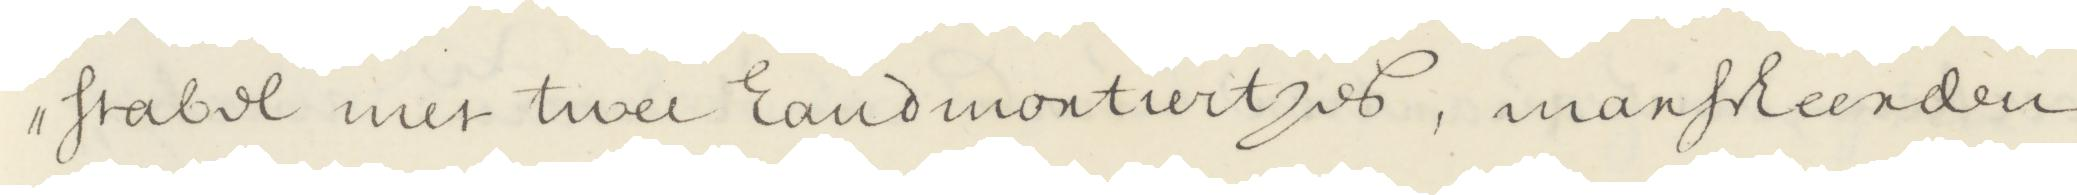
„stabel met twee handmortiertjes, marscheerden
